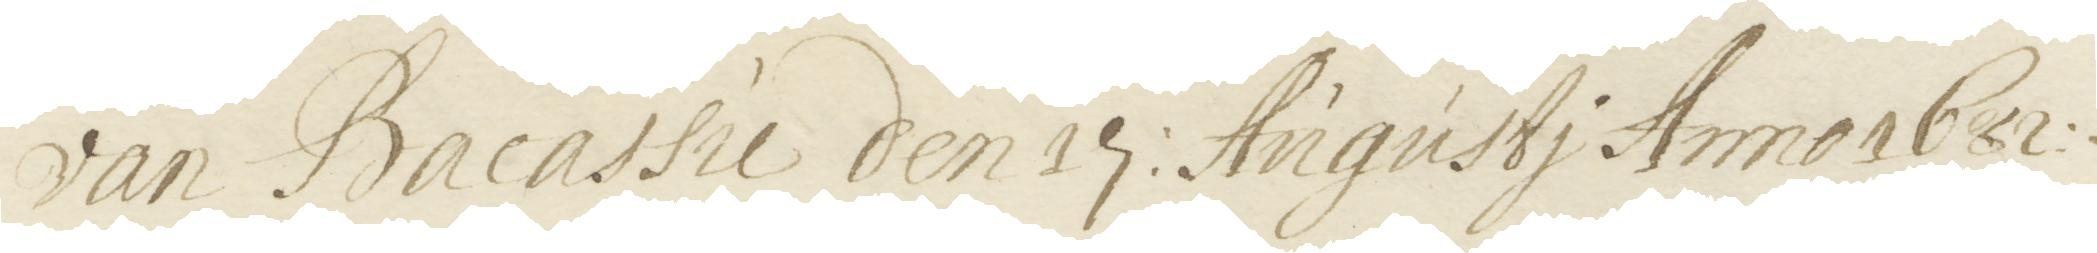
van Bacassie den 17: Augustj Anno 1682:
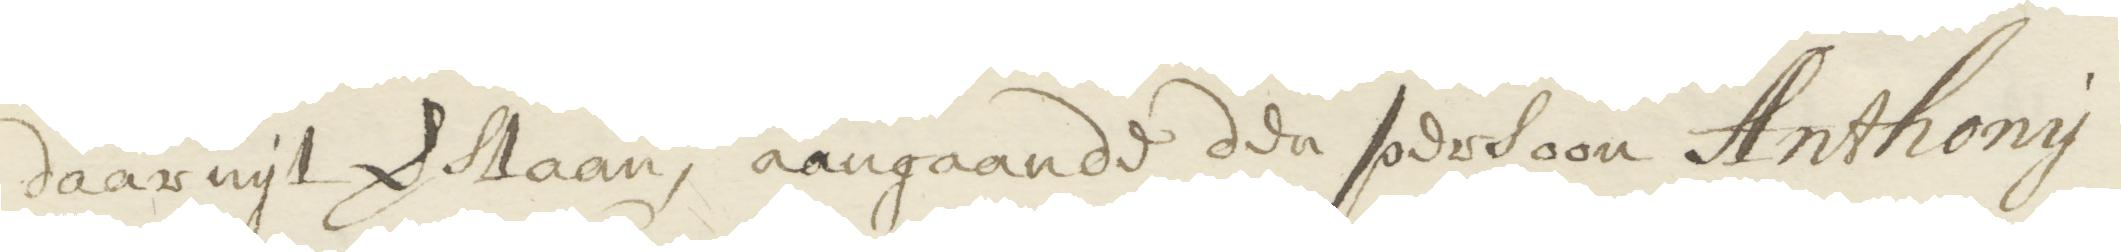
daar uijt verstaan; aangaande den persoon Anthonij
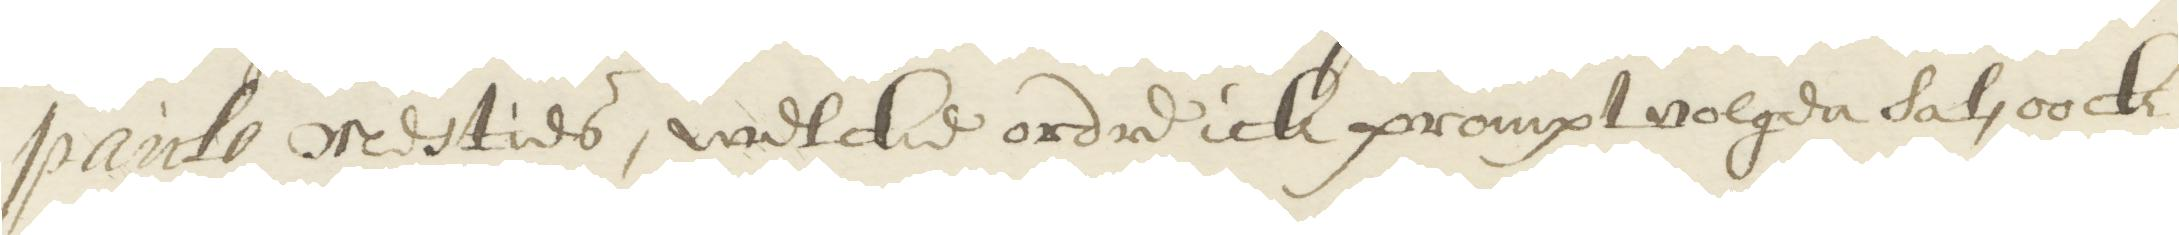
paulo mesties, welcke ordre ick prompt volgen sal, oock
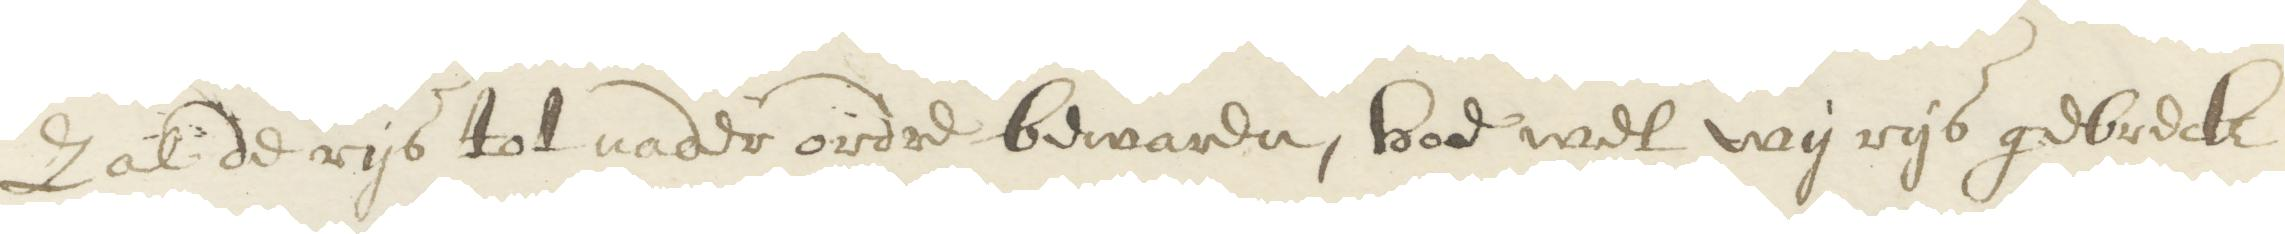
Zal: de rijs tot nader ordre bewaren, hoe wel wij rijs gebreck
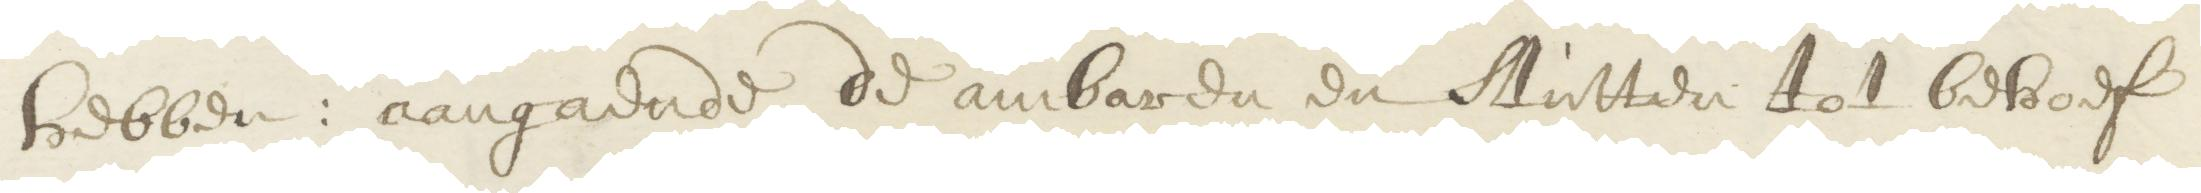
hebben: aangaende de ambaren en stutten tot behoef
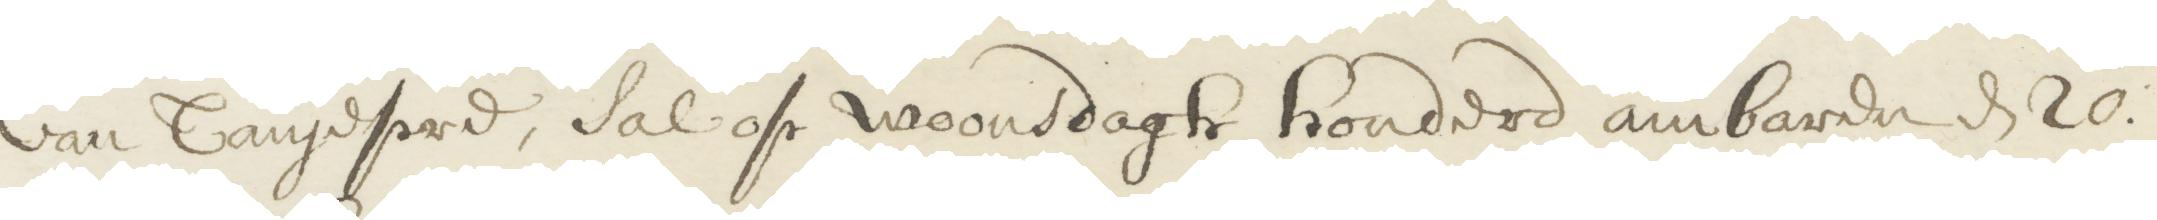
van Tanjepre, Sal op woonsdagh honderd ambaren en 20:
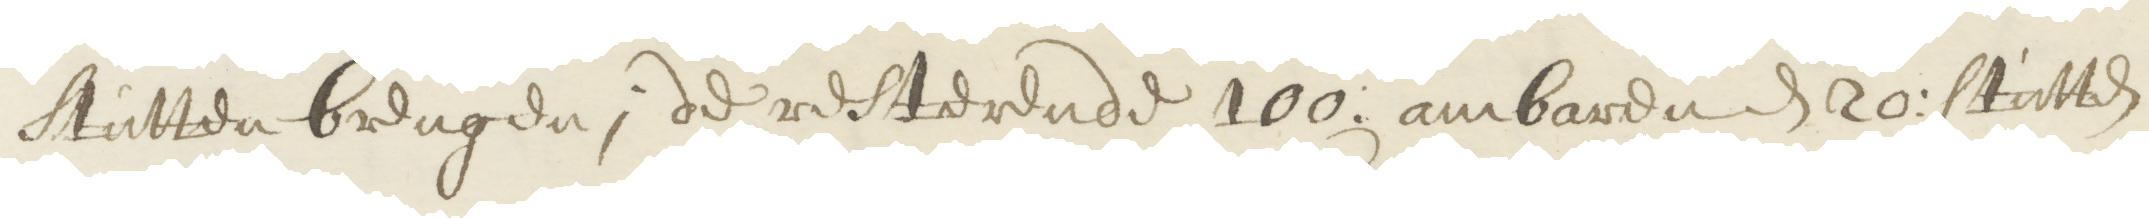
Stutten brengen, de resterende 100: ambaren en 20: stutten
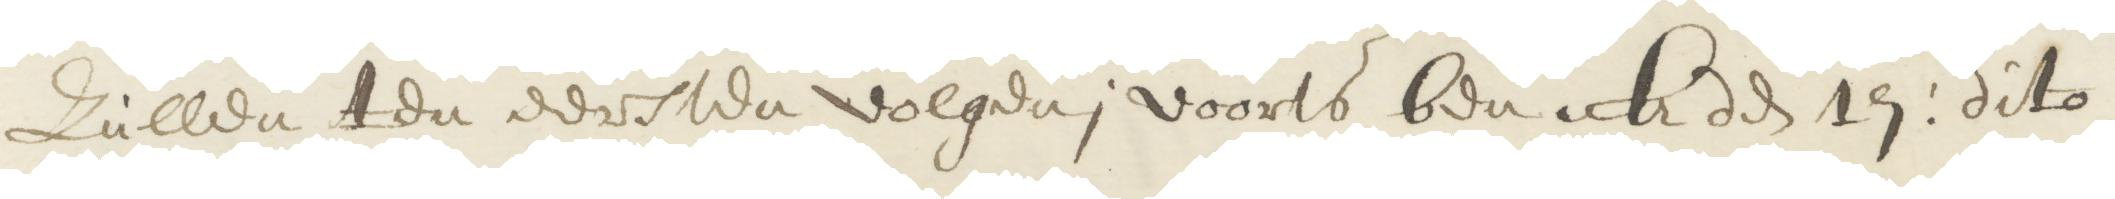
Zullen ten eersten volgen; voorts ben ick den 17: dito
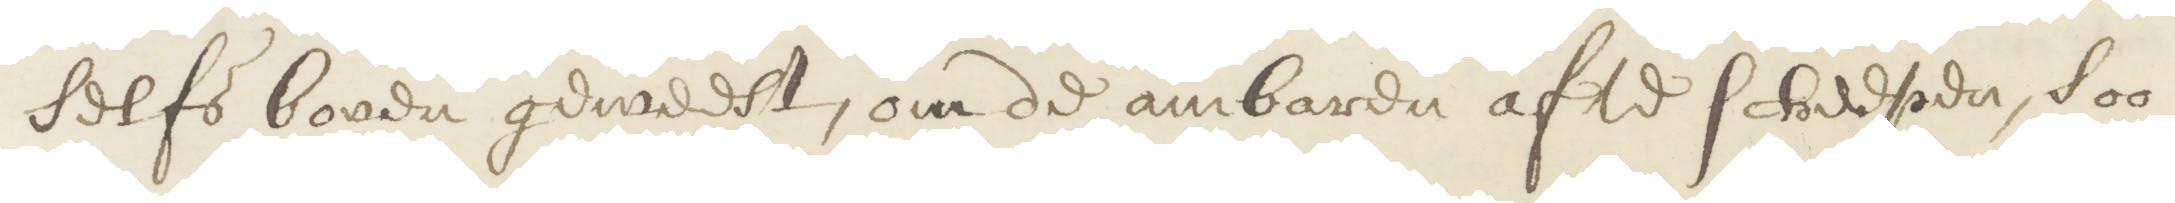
Selfs boven geweest, om de ambaren afte scheepen, Soo
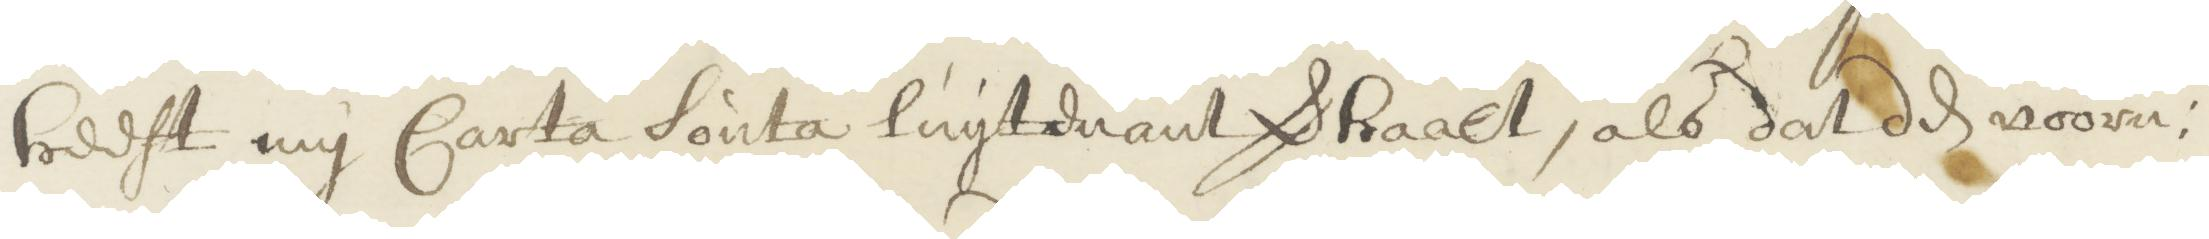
heeft mij Carta Souta luijtenant verhaalt, als dat den voorn:e
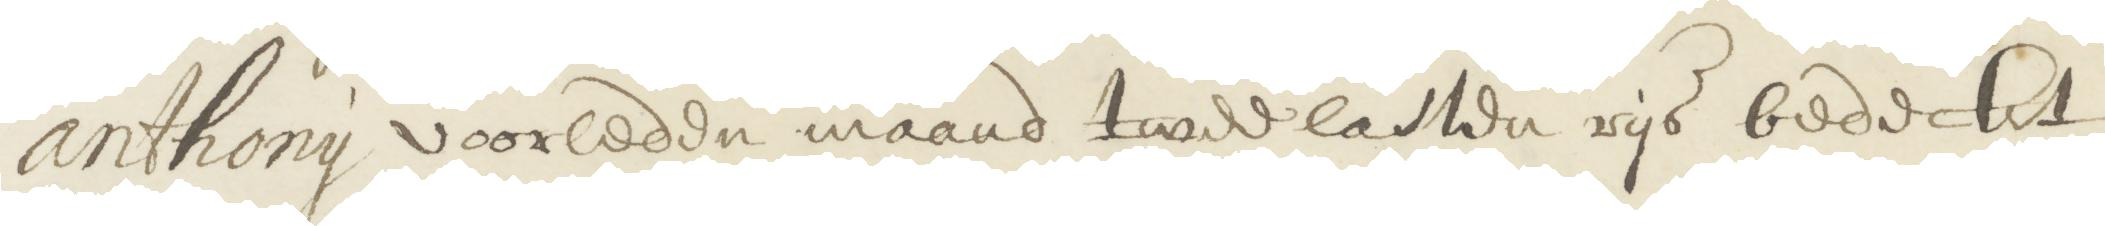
anthonij voorleden maand twee lasten rijs bedeckt
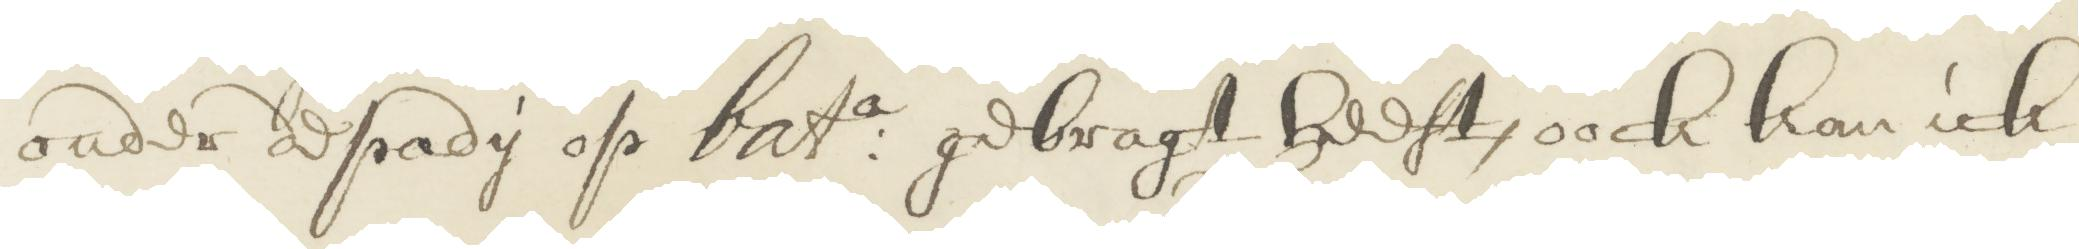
onder de padij op bat:a gebragt heeft, oock kan ick
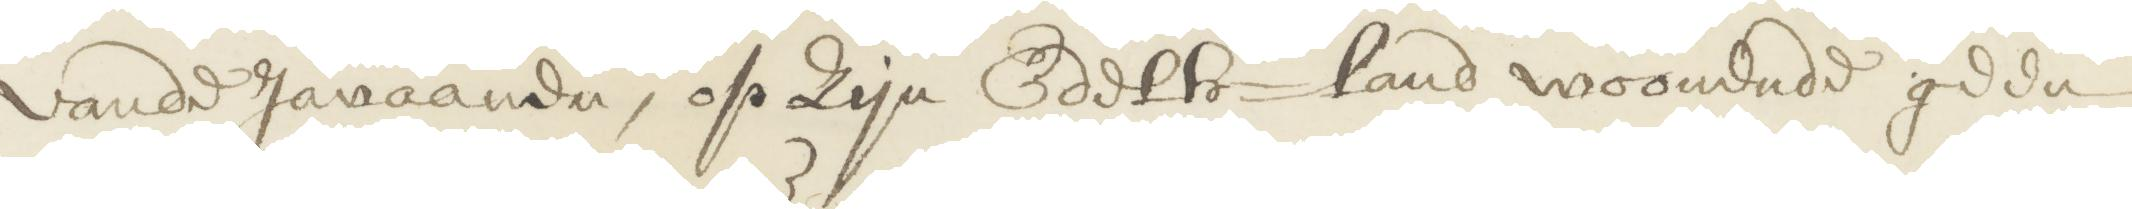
vande Javaanen, op zijn Edelh=ds land woonende geen
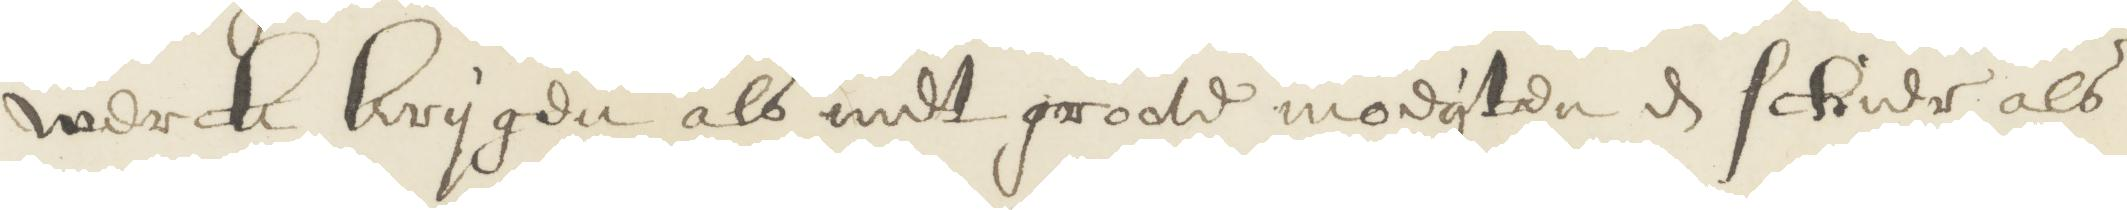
werk krijgen als met groote moeijten en schier als
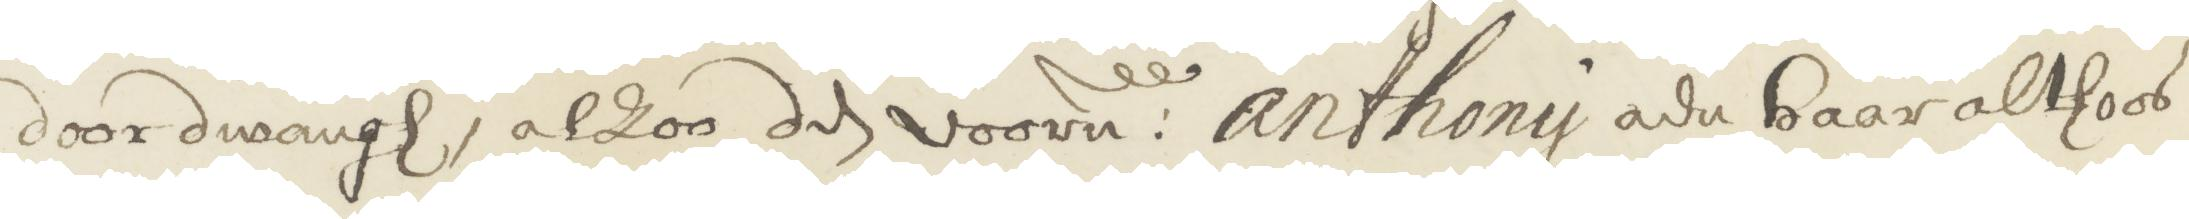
door dwangh, al Zoo den voorn:e anthonij aen haar althoos
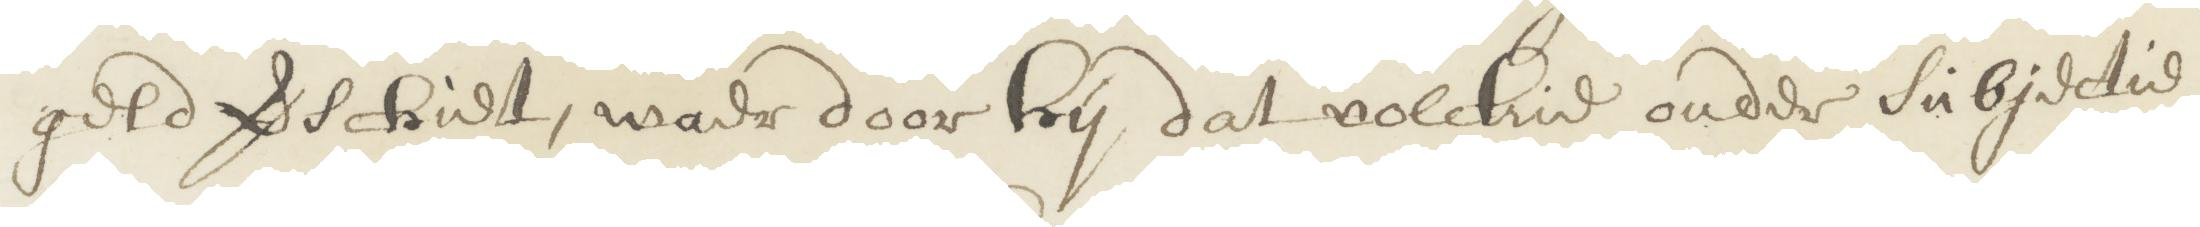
geld verschiet, waer door hij dat volckie onder Subjectie
